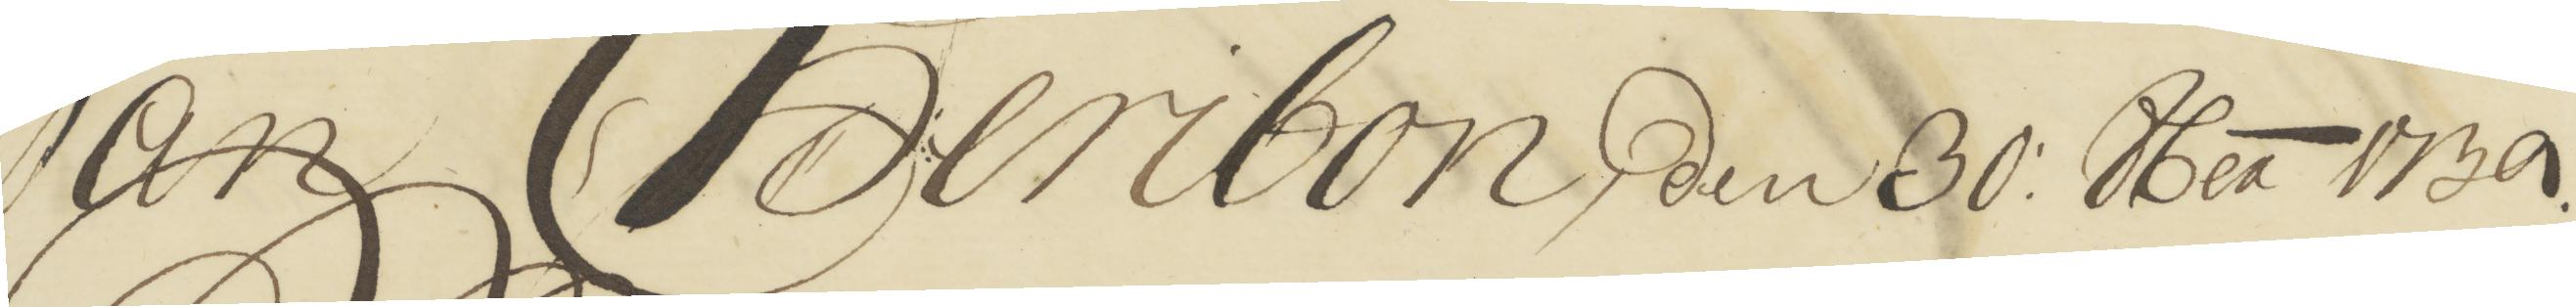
Van Cheribon, den 30: 8ber 1734
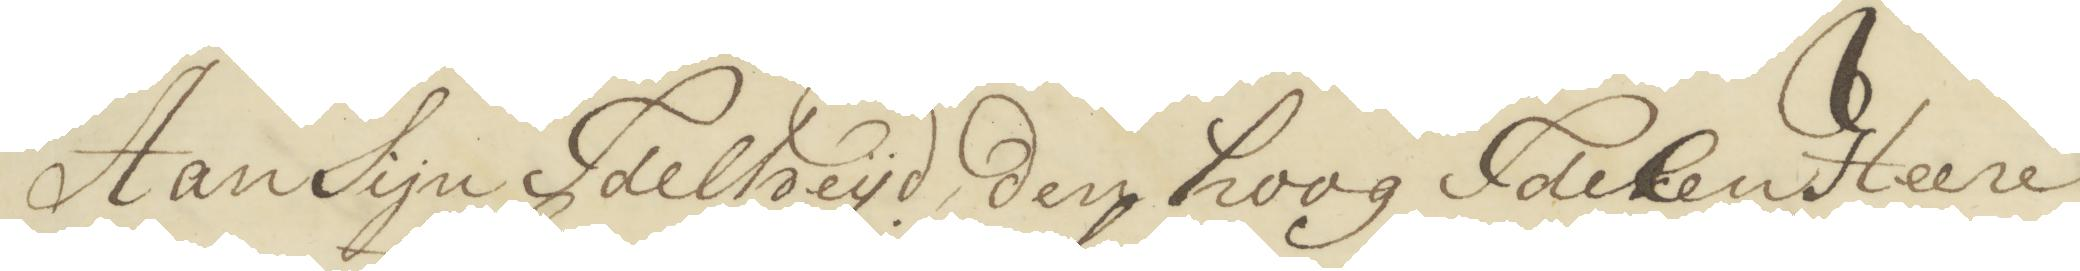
Aan sijn Edelheijd, den hoog Edelen Heere
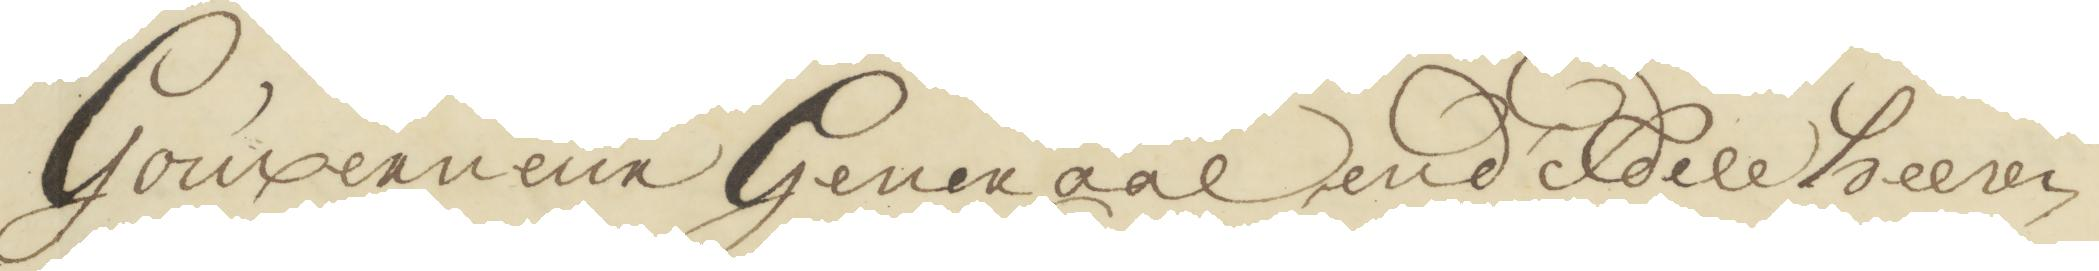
Gouverneur Generaal en d’ Edele heeren
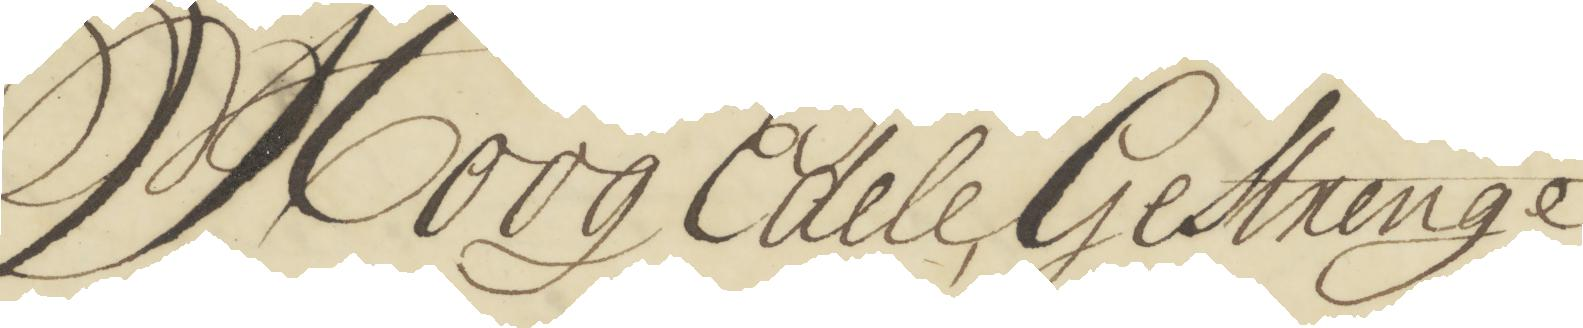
Hoog Edele Gestrenge
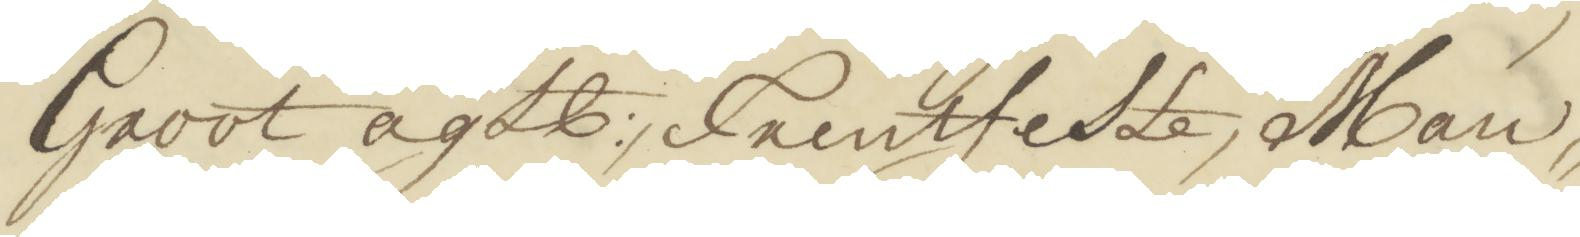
Groot agtb:, Erentfeste, Man„
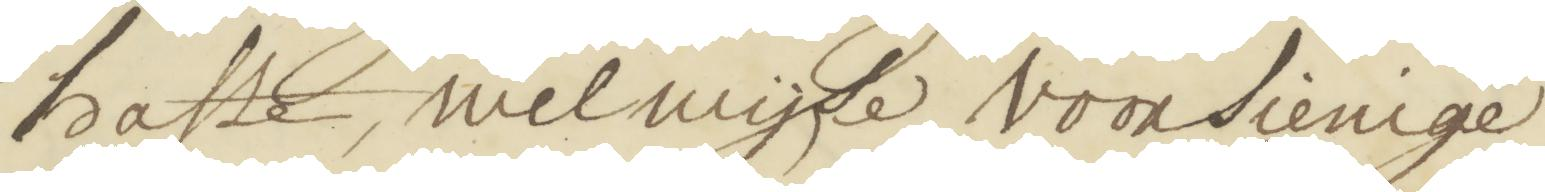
hafte, wel wijse, voorsienige,
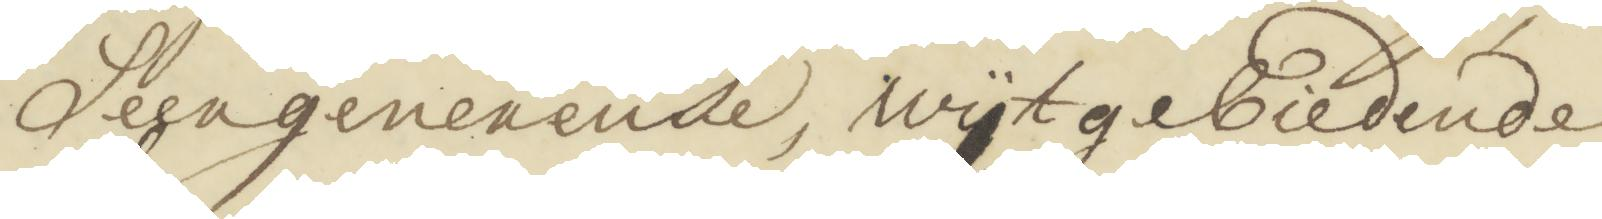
seer genereuse, wijt gebiedende
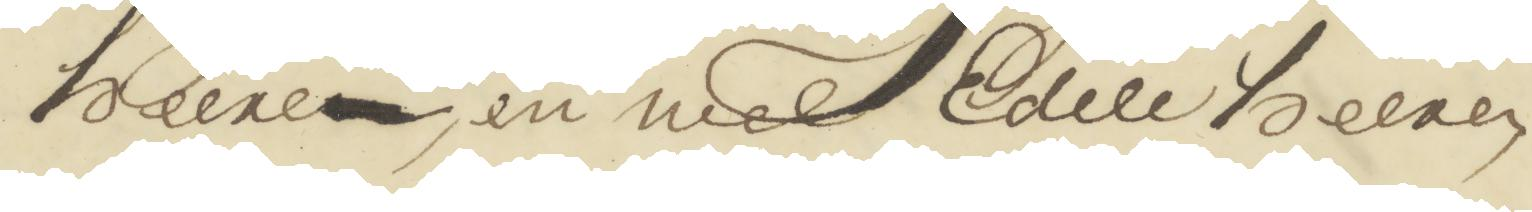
heeren, en wel Edele heeren
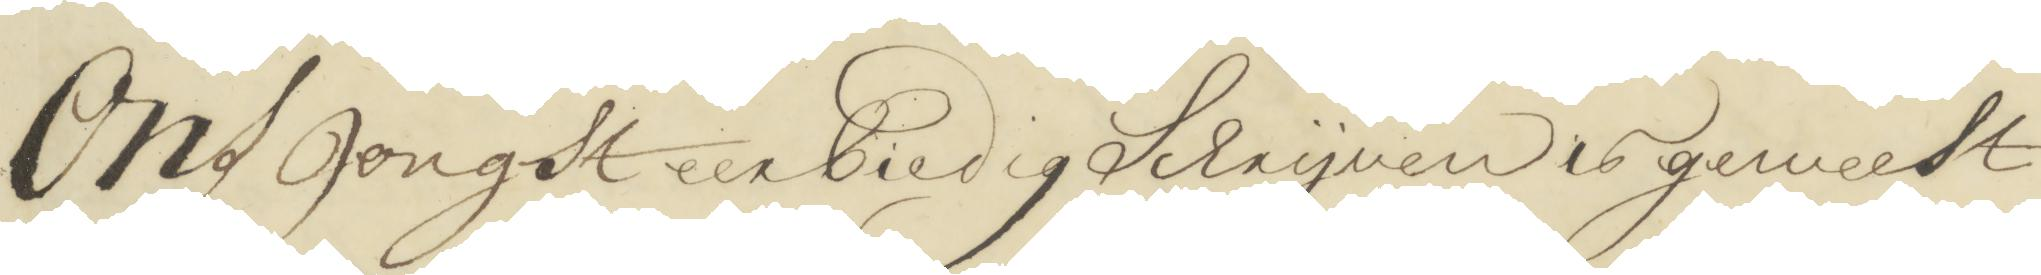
Ons Jongst eerbiedig schrijven is geweest
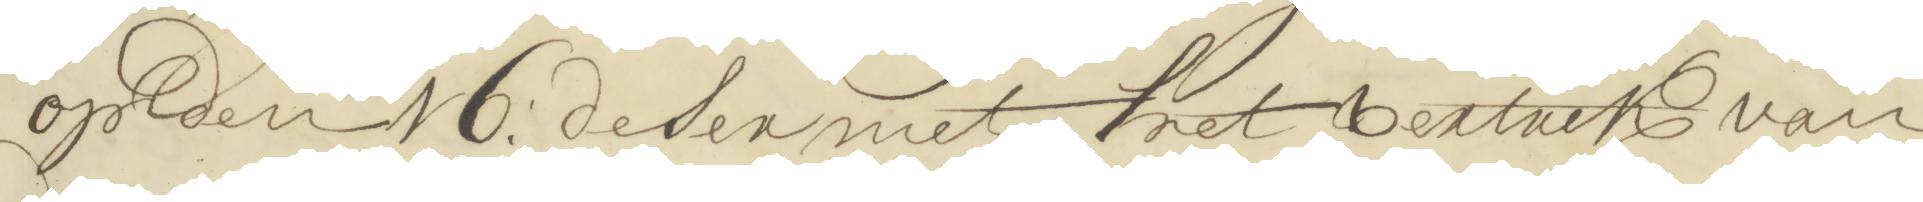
op den 16: deser met het vertrek van
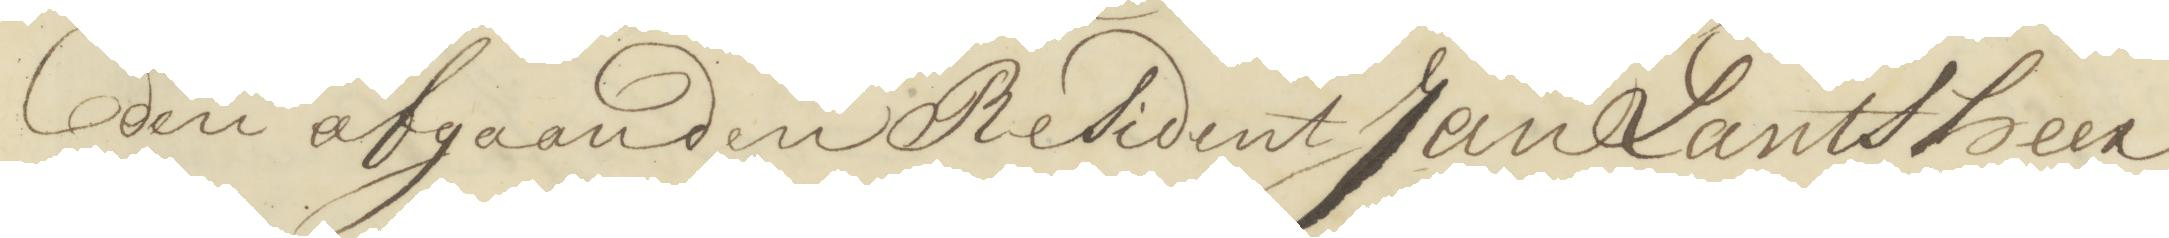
den afgaanden Resident Jan Lantsheer
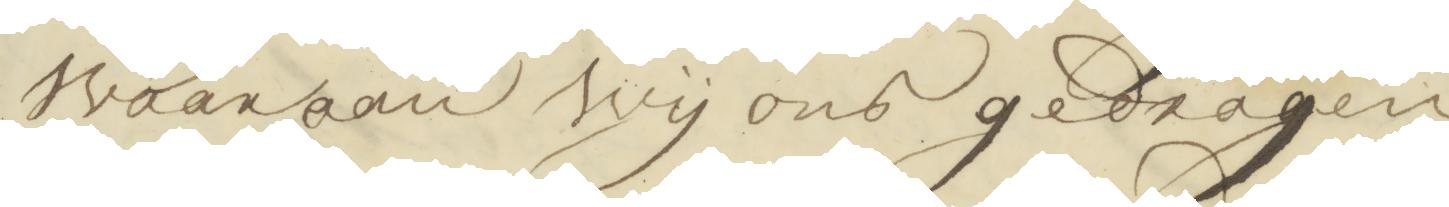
waar aan wij ons gedragen
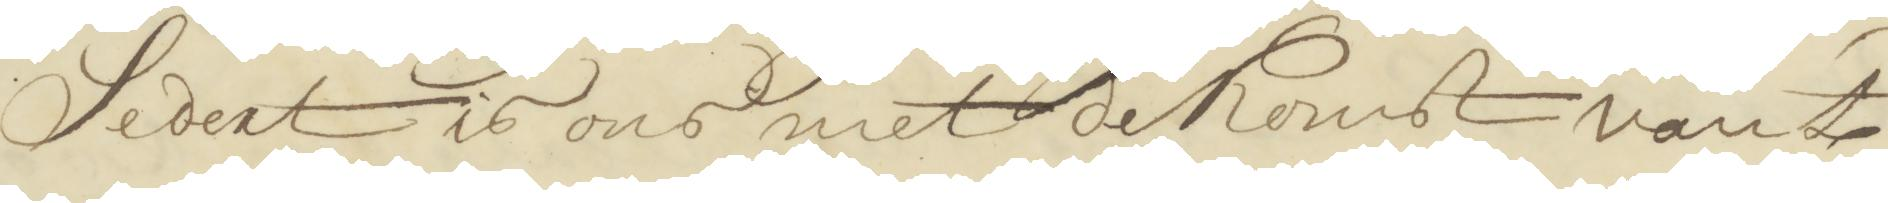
Sedert is ons met de komst van 't
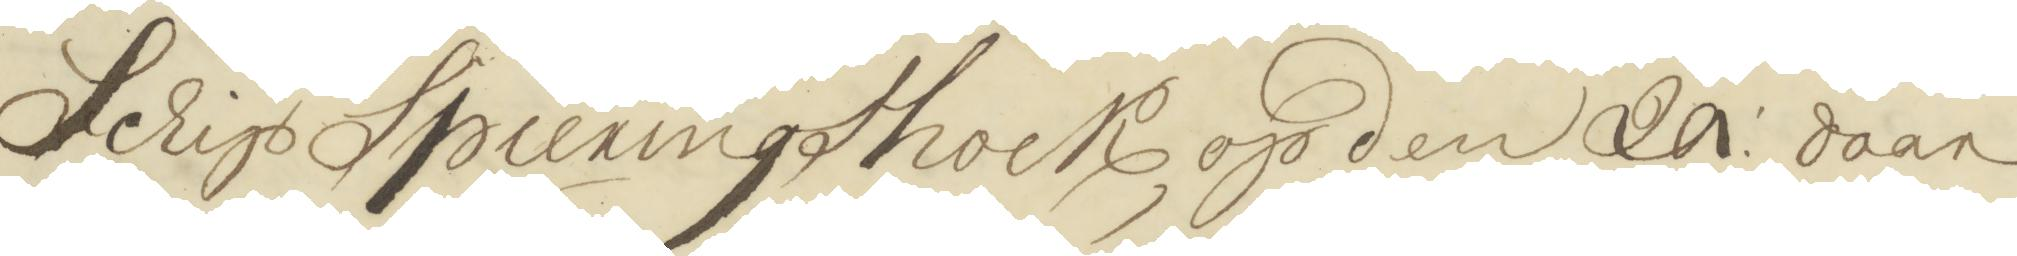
schip spieringshoek op den 24: daar
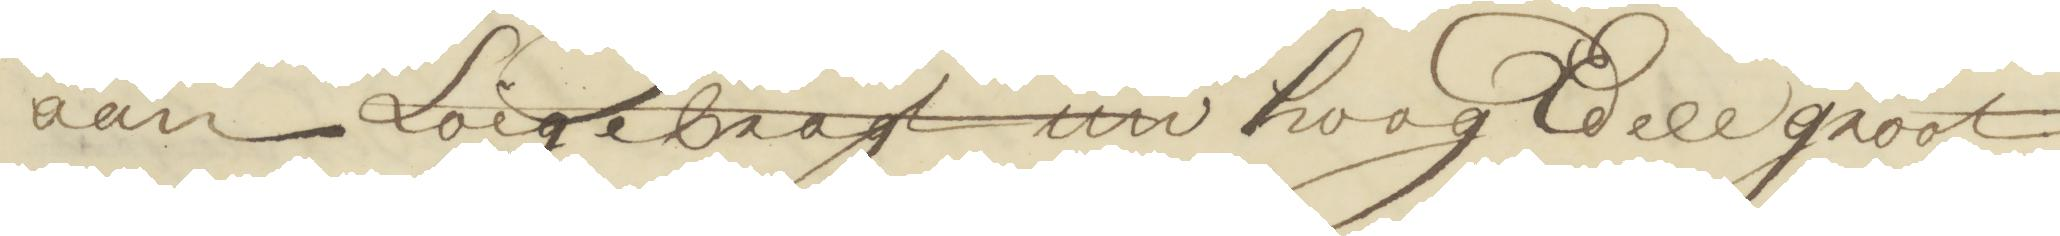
aan toegebragt uw hoog Edele groot
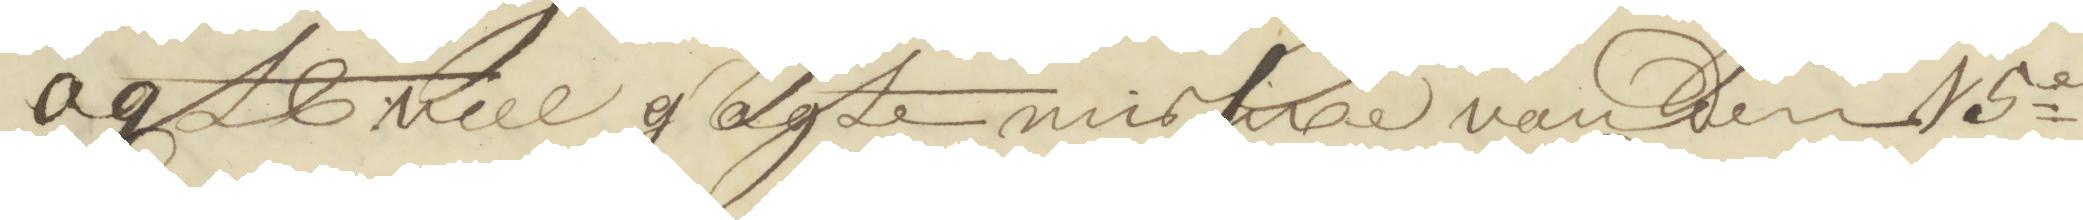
agtb veel g’agte missive van den 15=e
